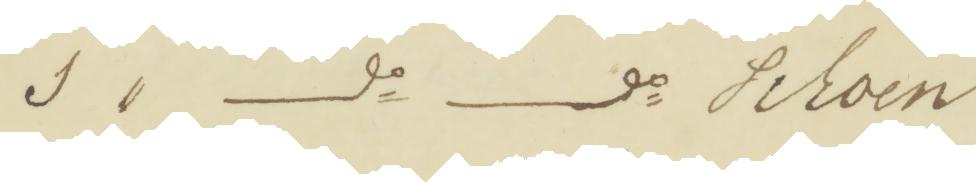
1 „ _=o _=o schoen
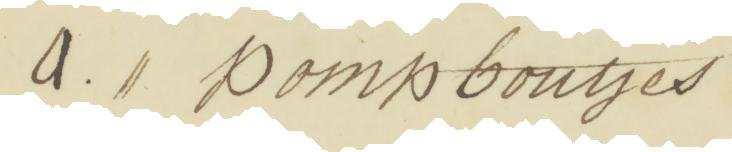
4. „ Pompboutjes
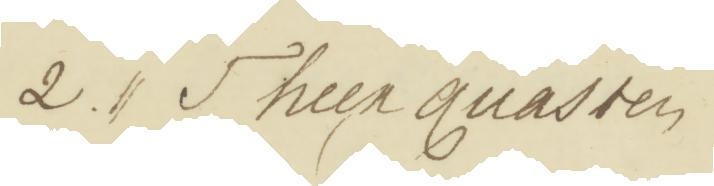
2. „ Theer quasten
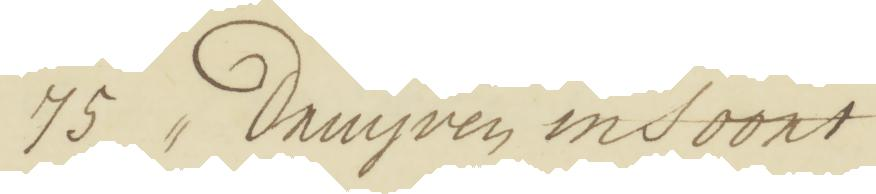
75 „ Druijven in soort
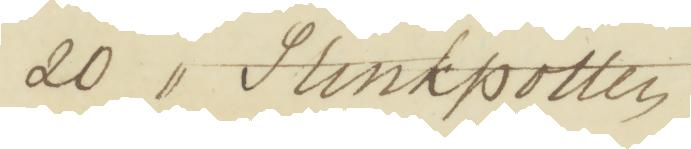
20 „ stinkpotten
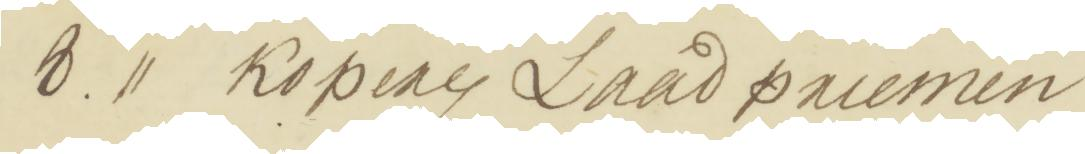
8. „ kopere Laad priemen
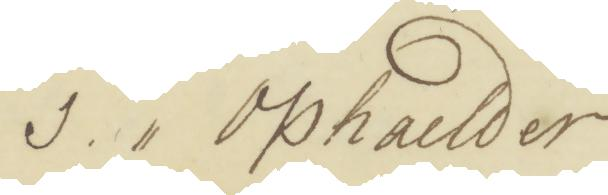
1. „ ophaelder
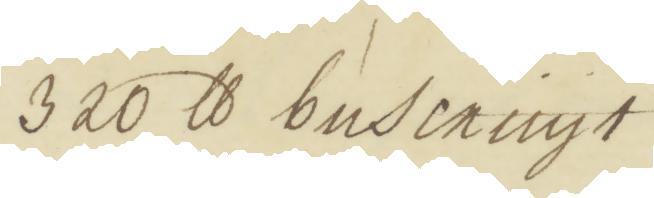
320 lb buscruijt
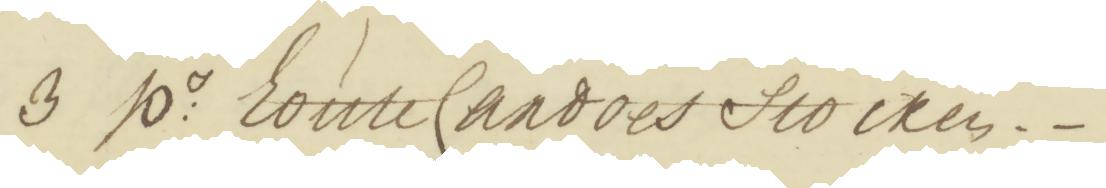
3 p:s houte Cardoes stocken. -
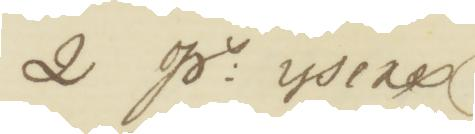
2 p:s ijsere
